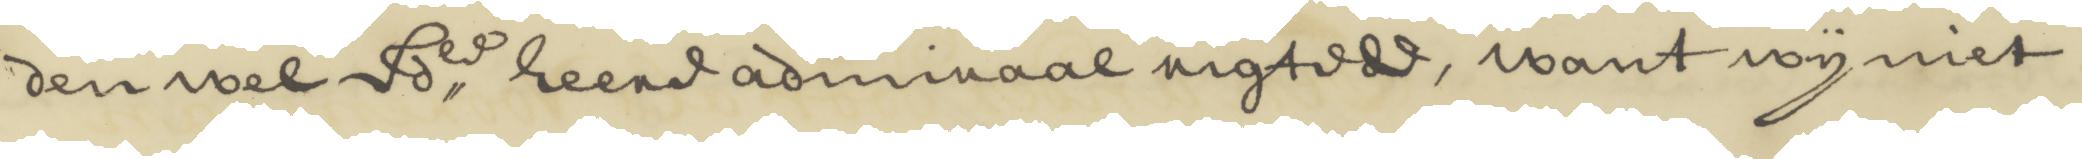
den wel Ed„le heere admiraal rigtede, want wij niet
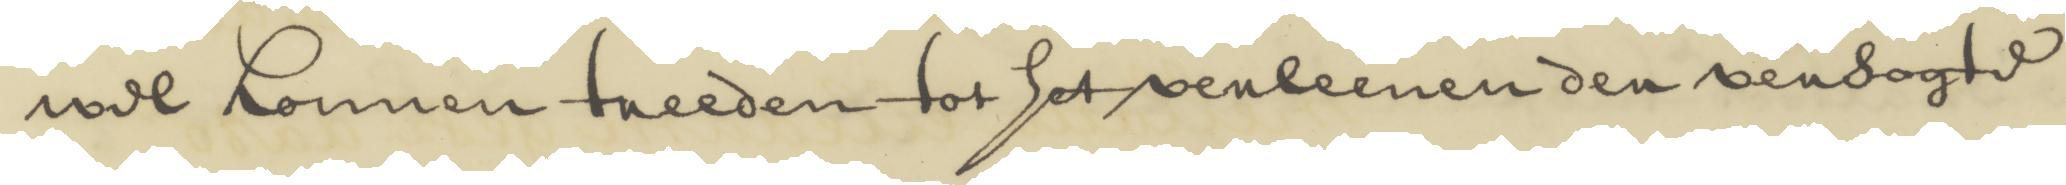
wel konnen treeden tot het verleenen der versogte
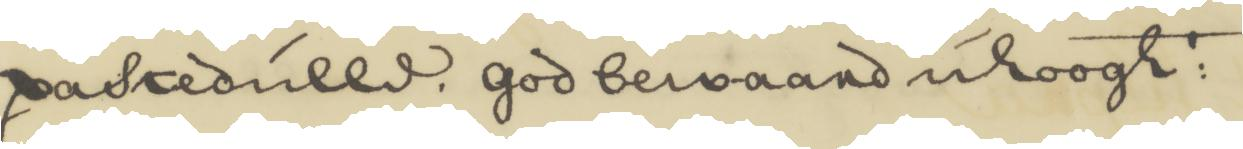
pascedulle, god bewaard u hoogh:t
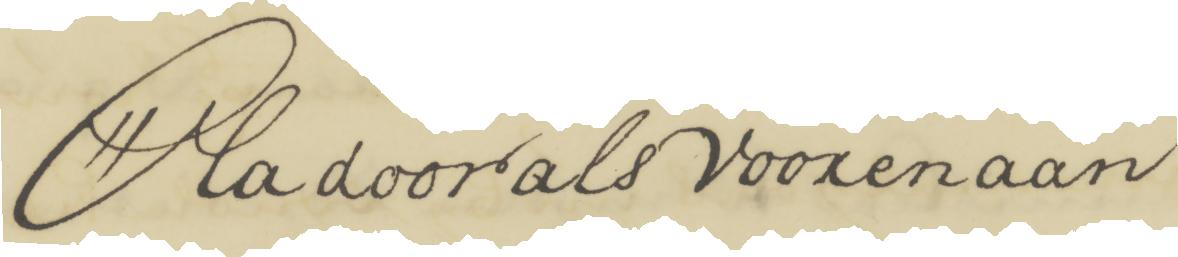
Ola door als vooren aan
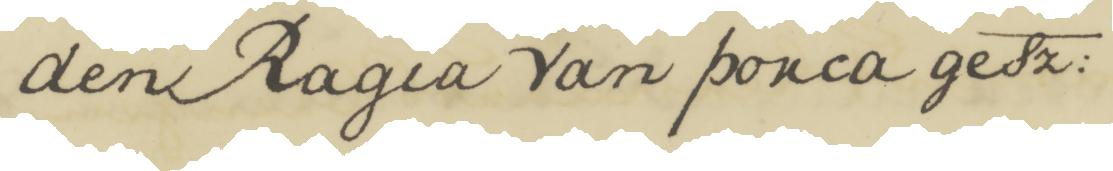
den Ragia van porca gesz:
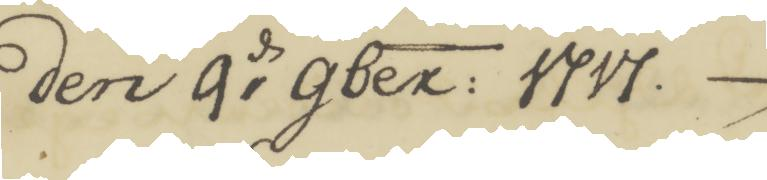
den 4„en 9ber: 1717.
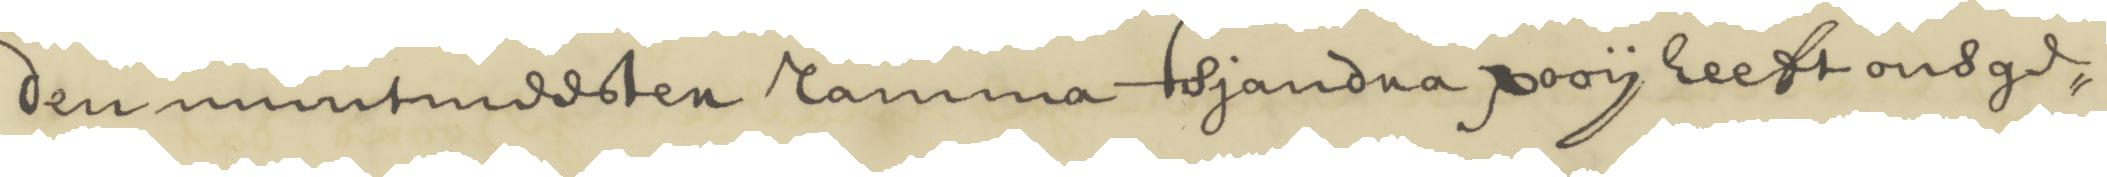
den muntmeester ramma tsjandra pooij heeft ons ge„
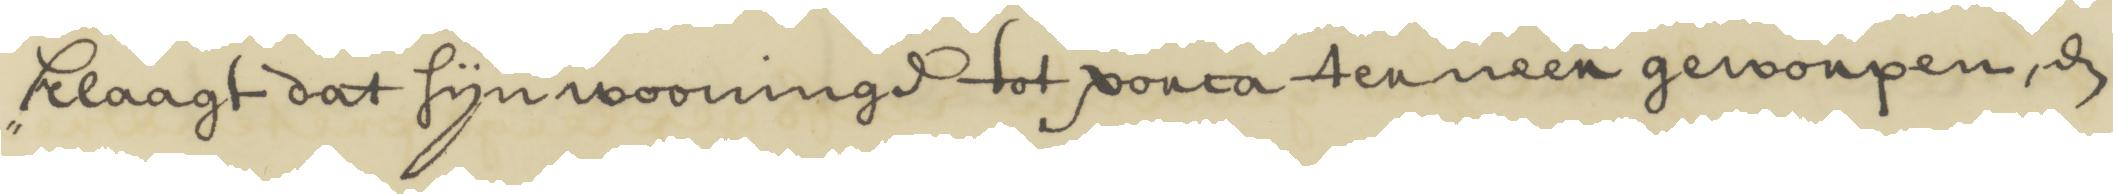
„klaagt dat sijn wooninge tot porca terneer geworpen, en
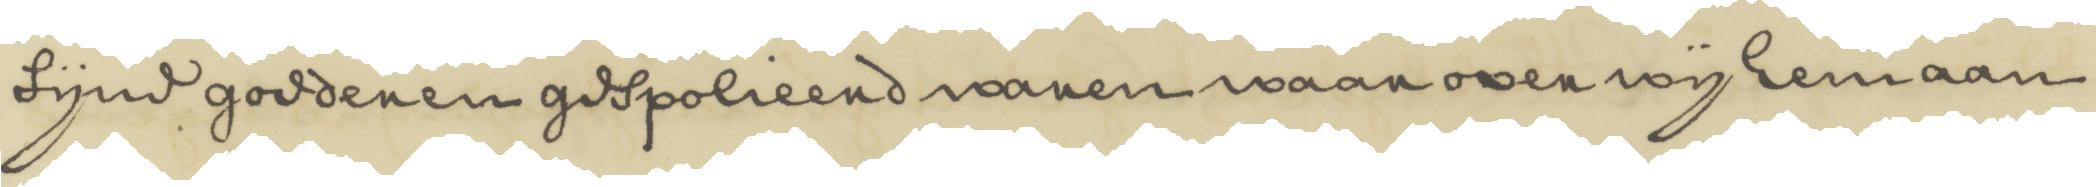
sijne goederen gespolieerd waren waar over wij hem aan
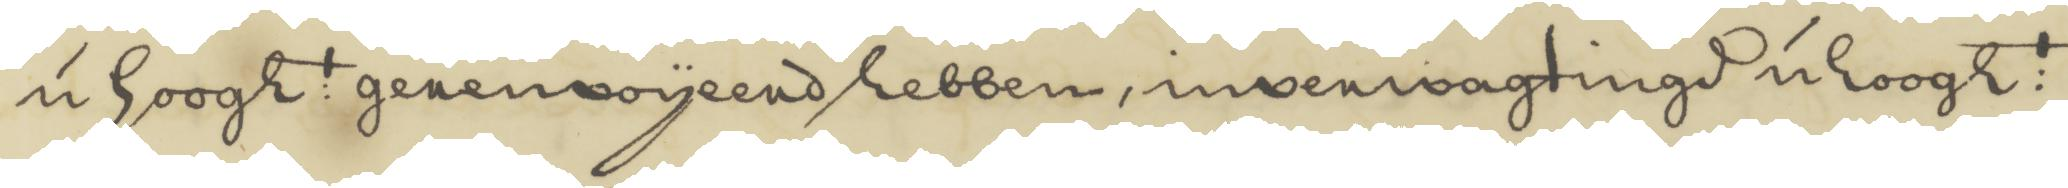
u hoogh:t gerenvoijeerd hebben, inverwagtinge u hoogh:t
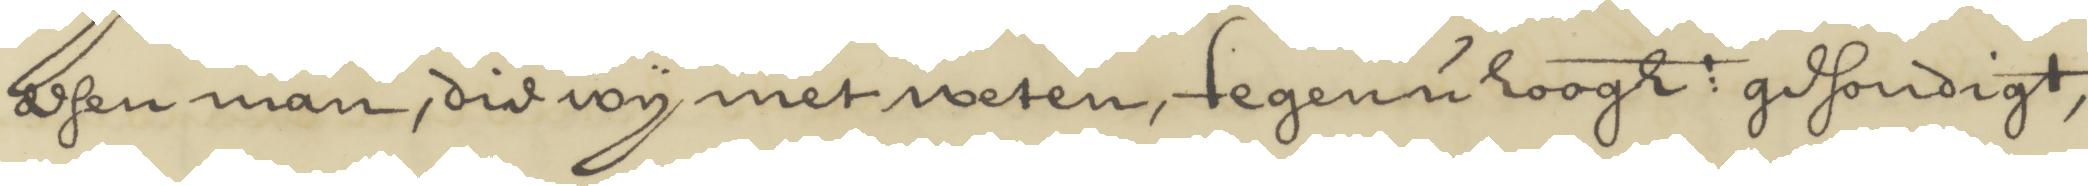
desen man, die wij niet weten, tegen u hoogh:t gesondigt
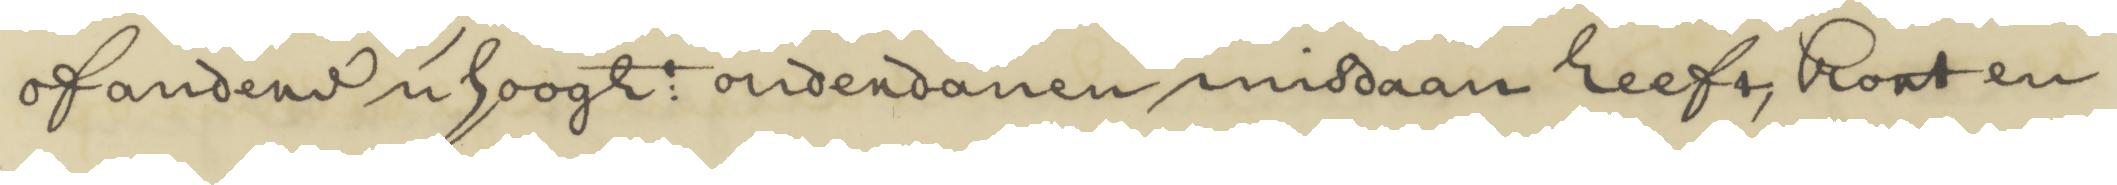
of andere u hoogh:t onderdanen misdaan heeft, kort en
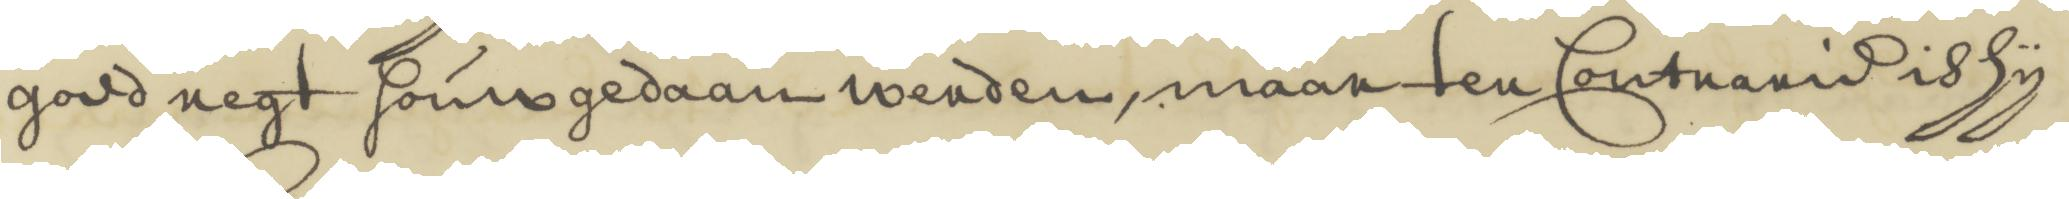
goed regt souw gedaan werden, maar ter Contrarie is hij
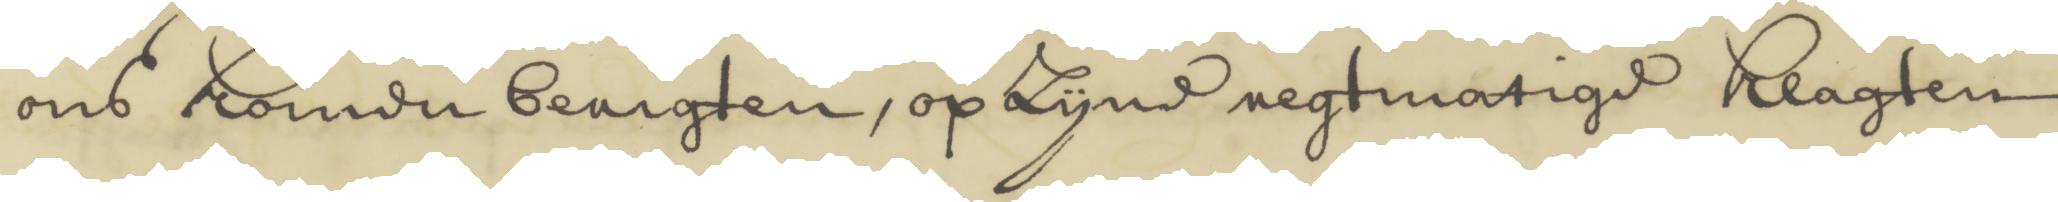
ons komen berigten, op zijne regtmatige klagten
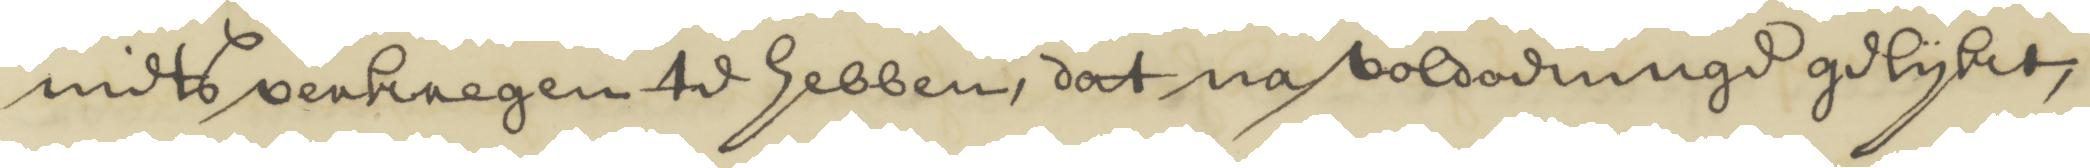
niets verkregen te hebben, dat na voldoeninge gelijkt,
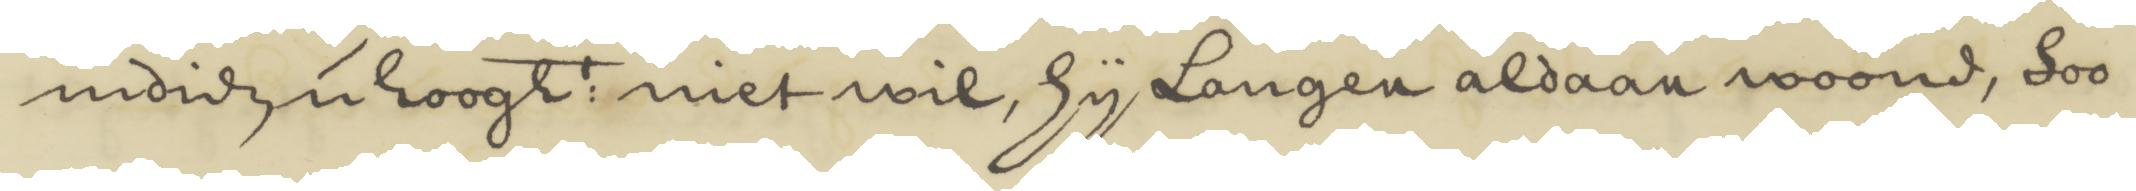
indien u hoogh:t niet wil, hij langer aldaar woone, soo
